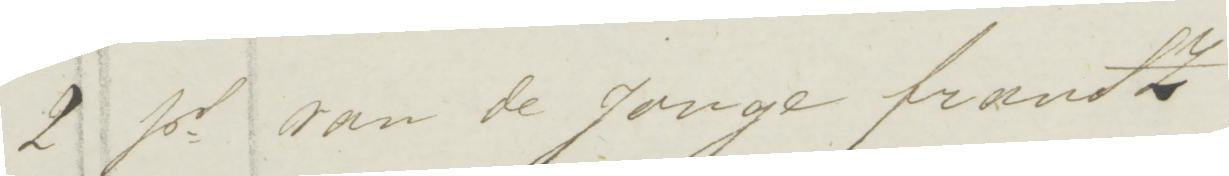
2 p=s van de jonge fransz
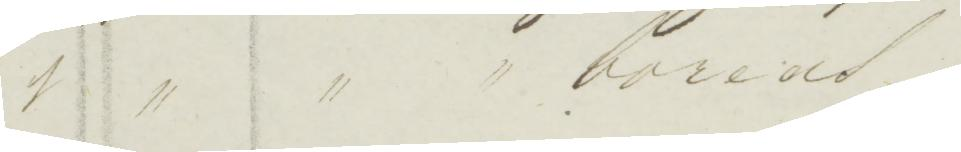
1 „ „ „ boreas
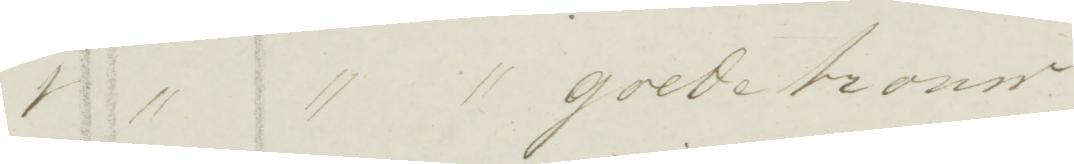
1 „ „ „ goede trouw
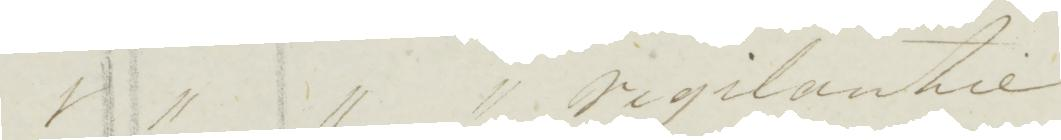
1 „ „ „ Vigilantie
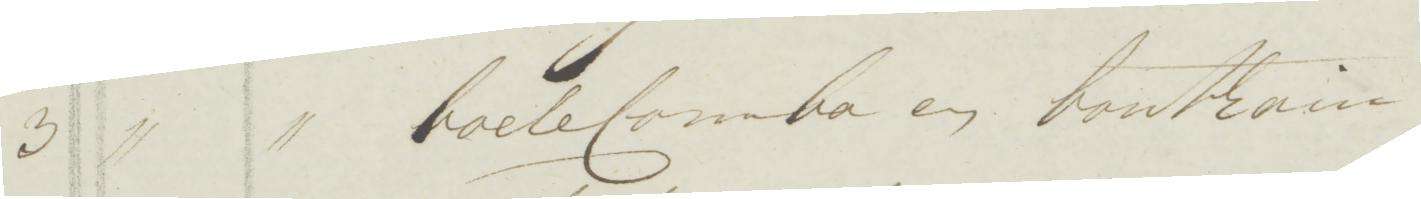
3 „ „ boelecomba en bonthain
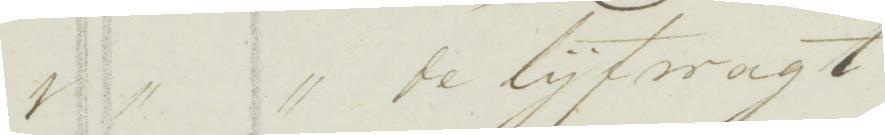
1 „ „ de lijf wagt
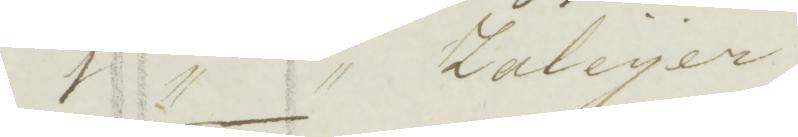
1 „ „ zaleijer
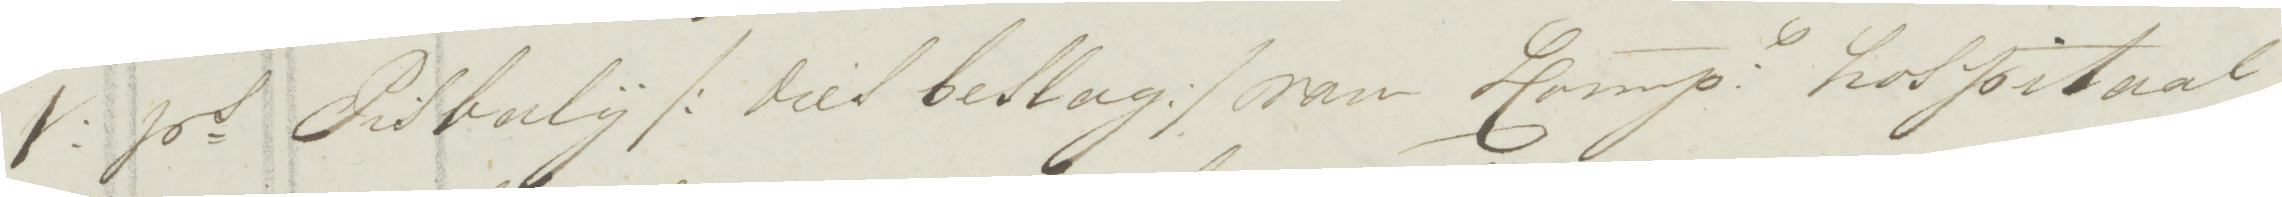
1: p=s Pisbalij /: dies beslag:/ van sComp:s hospitaal
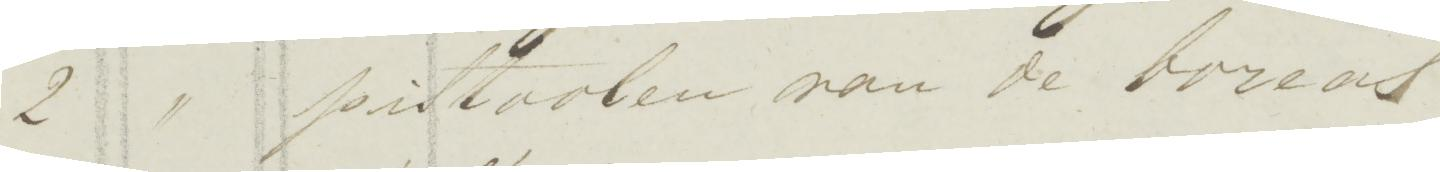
2 „ pistoolen van de boreas
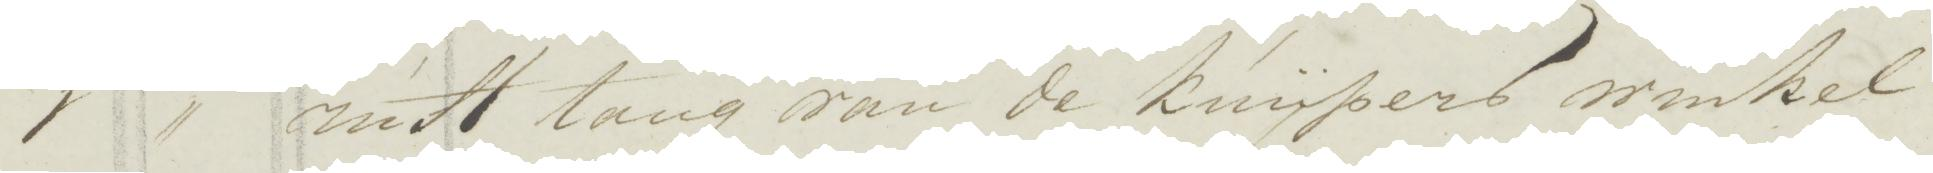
1 „ rust tang van de kuijpers winkel
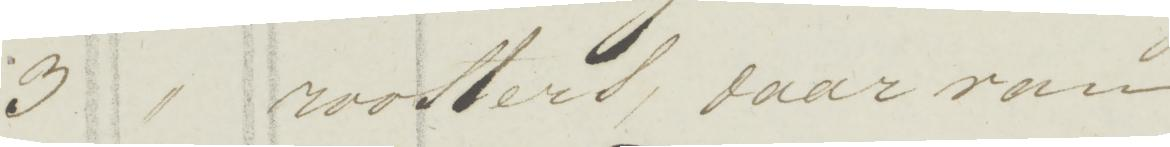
3 „ roosters, daar van
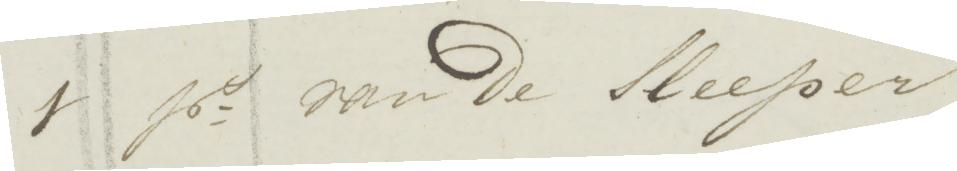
1 p=s van de sleeper
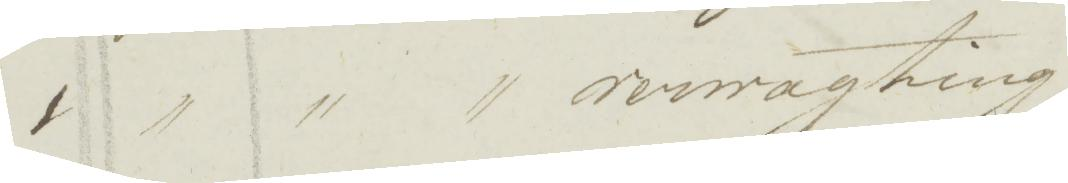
1 „ „ „ verwagting
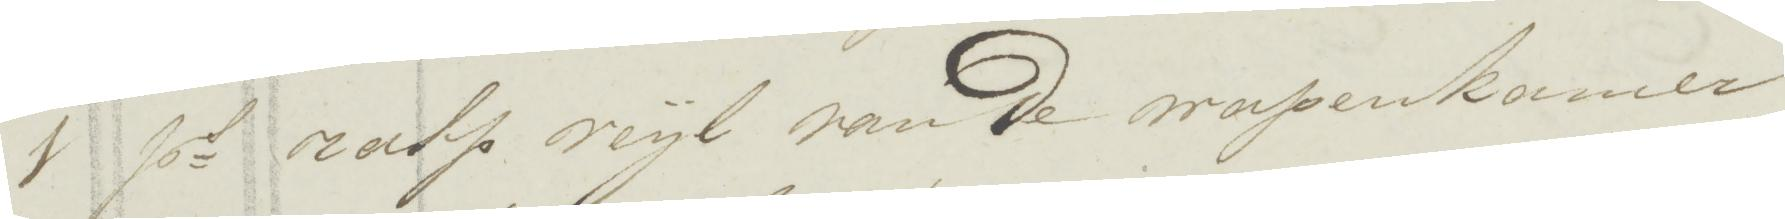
1 p=s rasp veijl van de wapenkamer
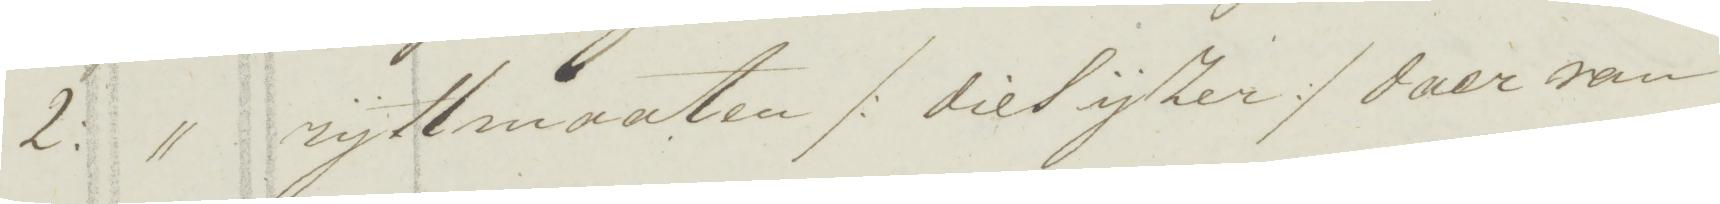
2: „ rijstmaaten /: dies ijzer :/ daer van
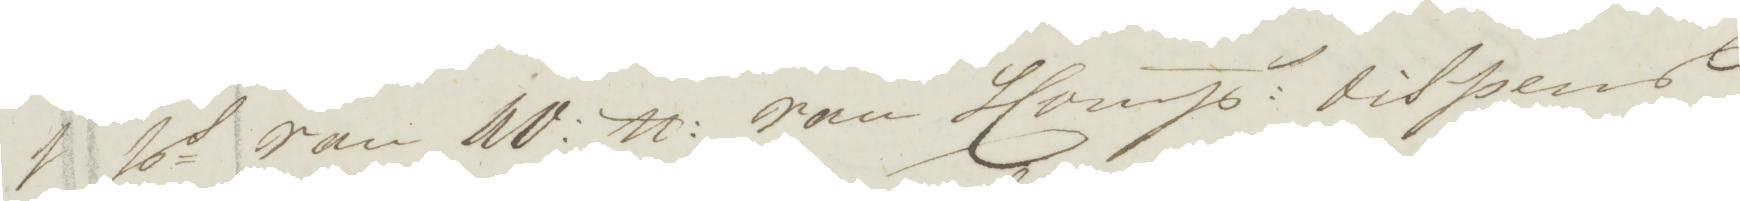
1 p=s van 40: lb: van sComp:s dispens
